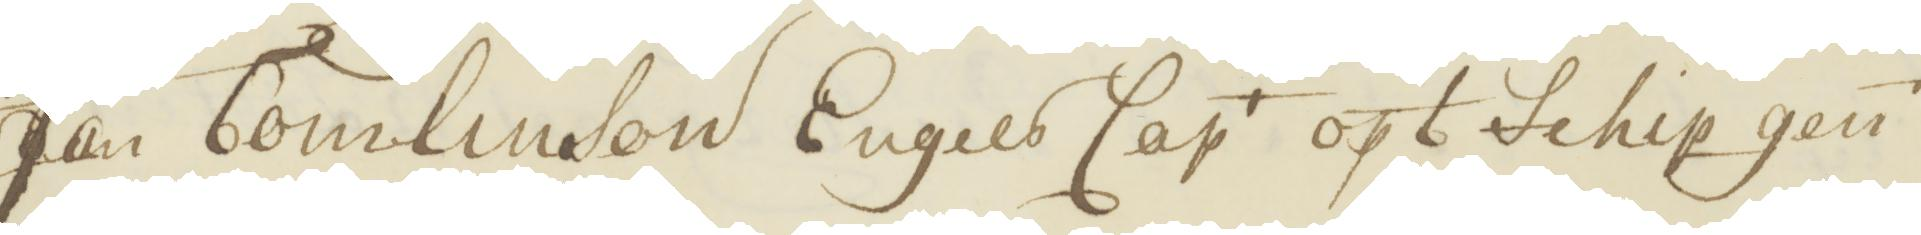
Jan bomlinson Engels Capt op't schip gen
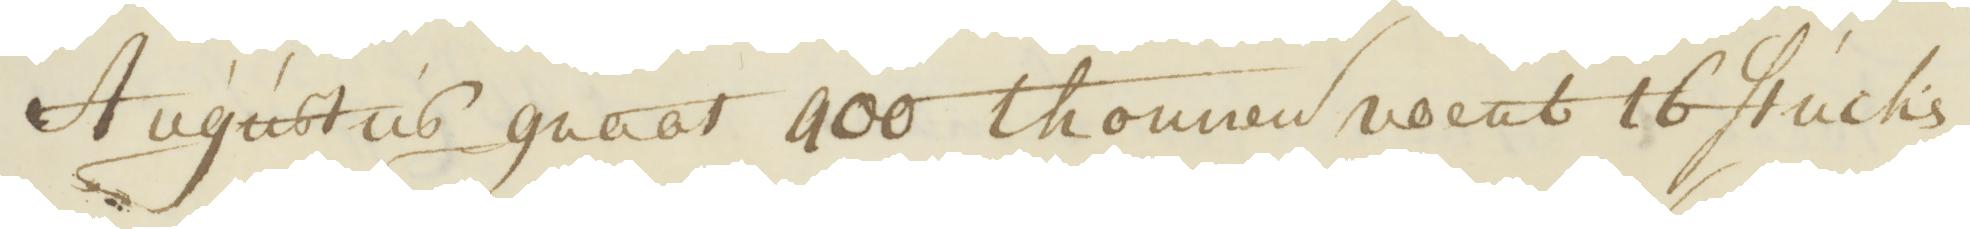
Augustus groot 400 thonnen voert 16 stucken
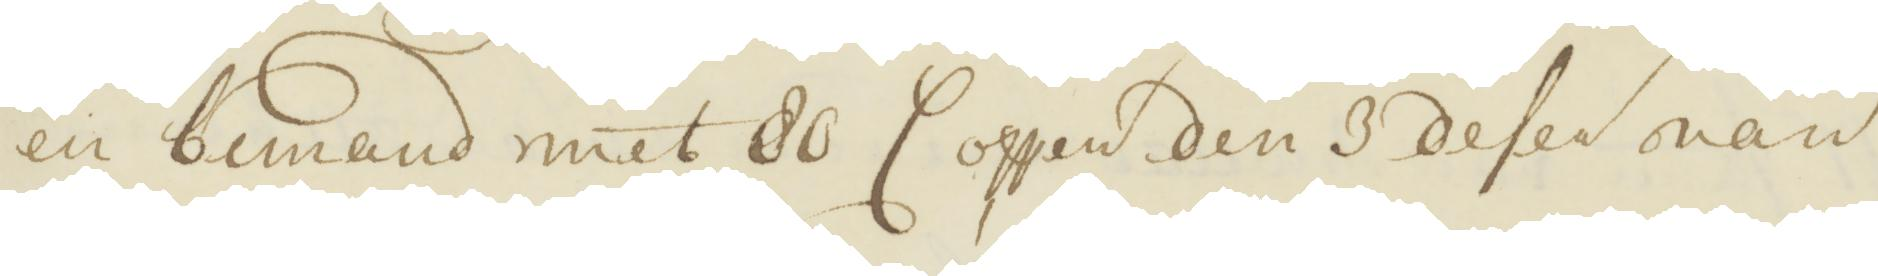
en bemand met 80 Coppen den 3 deser van
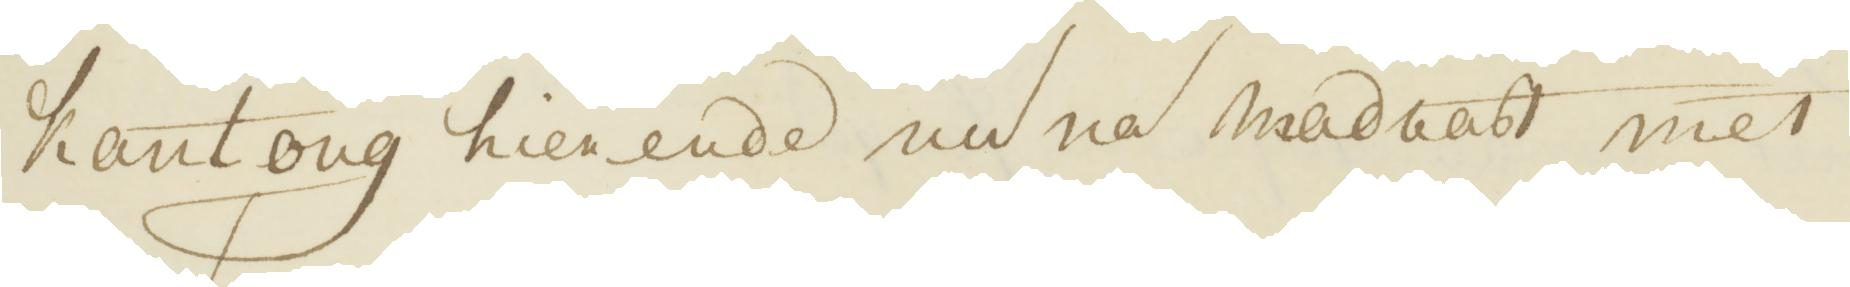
kantong hier ende nu na madrast met
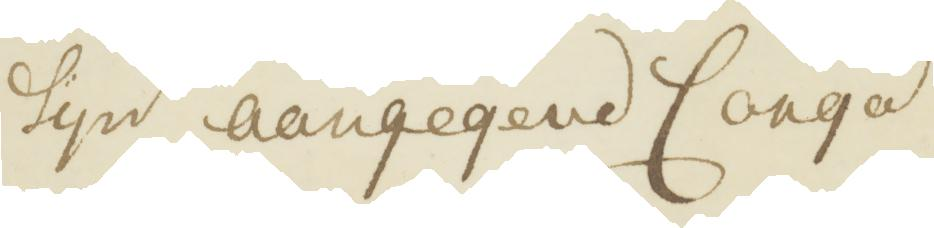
sijn aangegeve Corga
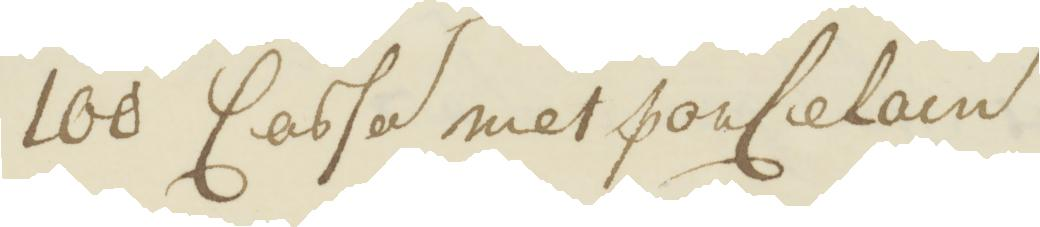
100 Cassa met porselain
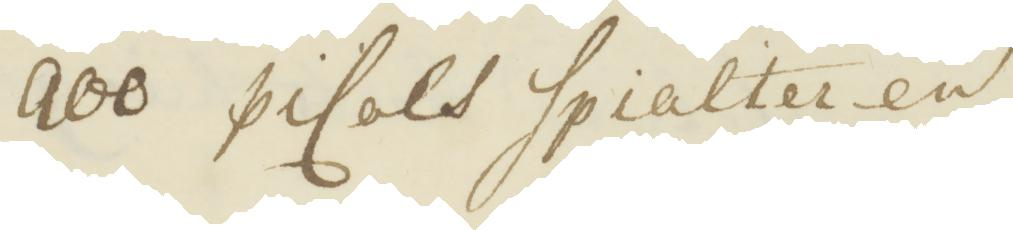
400 picals spialter en
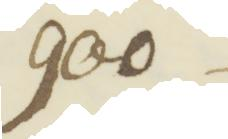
900
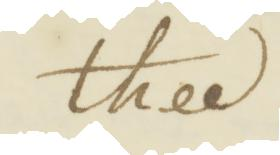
thee
